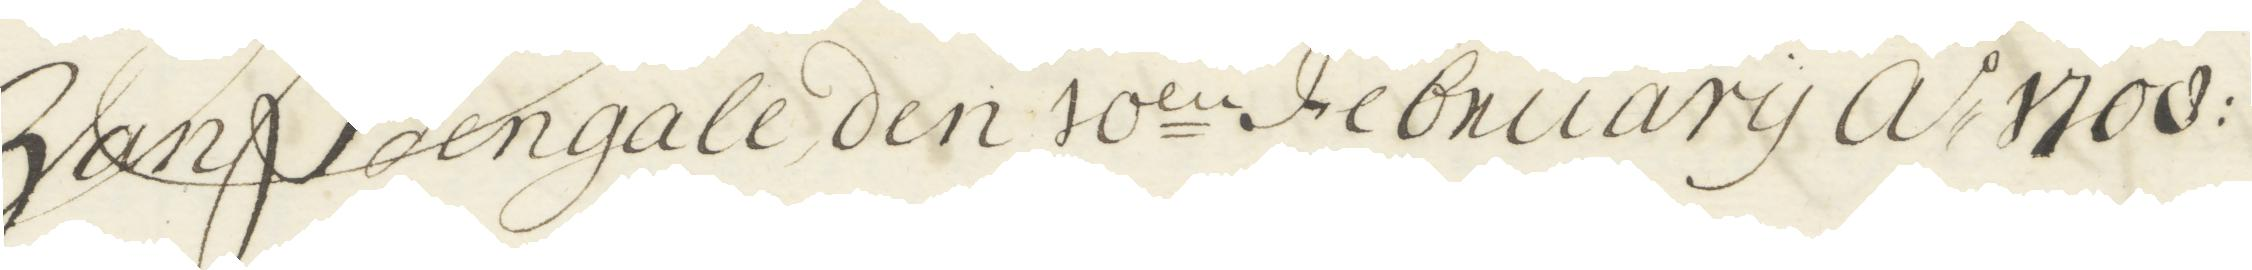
Van Bengale den 10=en Februarij a„o 1708:
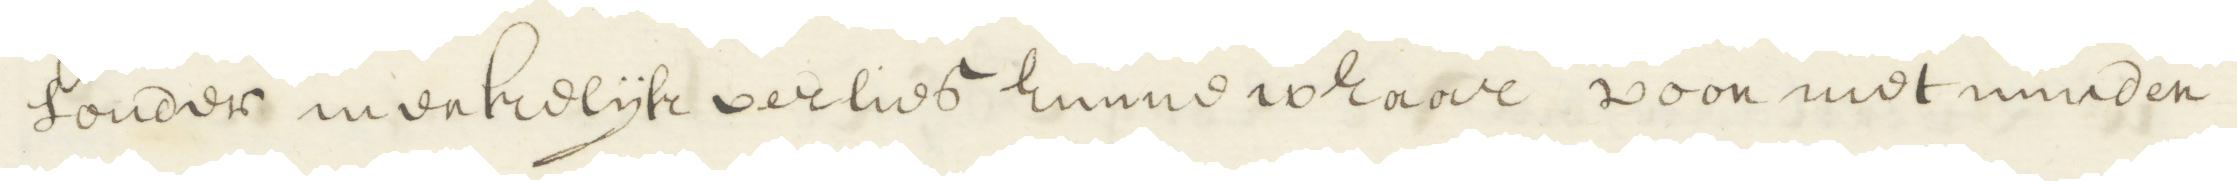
sonder merkelijk verlies hunne whaar voor met minder
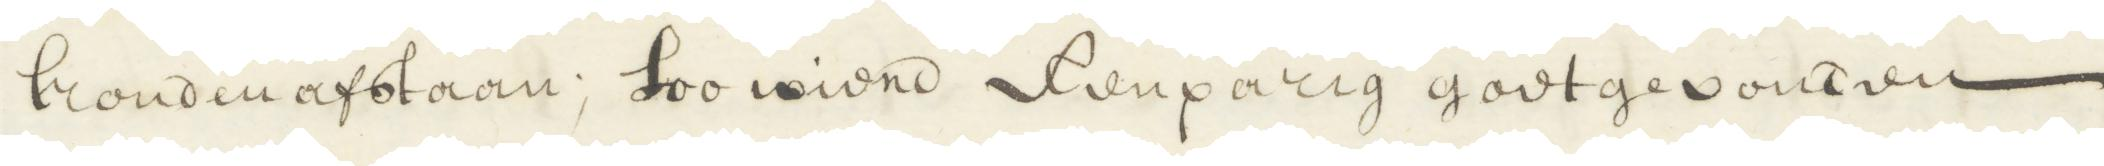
konden afstaan; soo wierd Eenparig goet gevonden
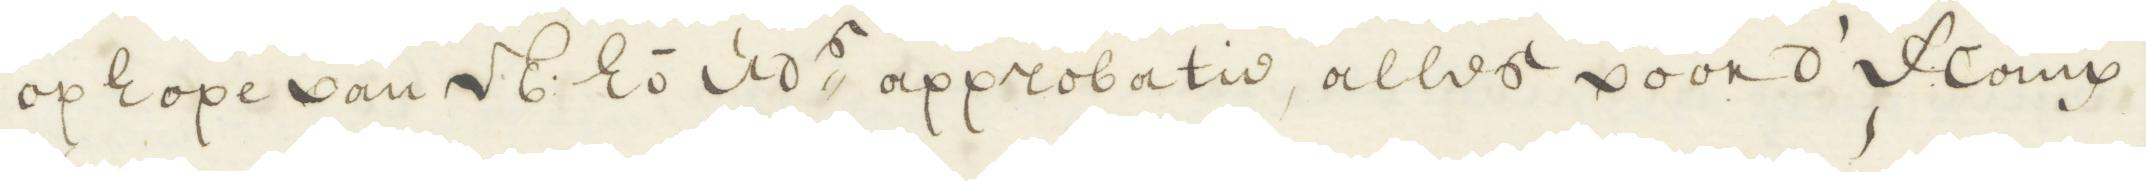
op hope van VE: ho Ed„s approbatie, alles voor d’ E: Compe
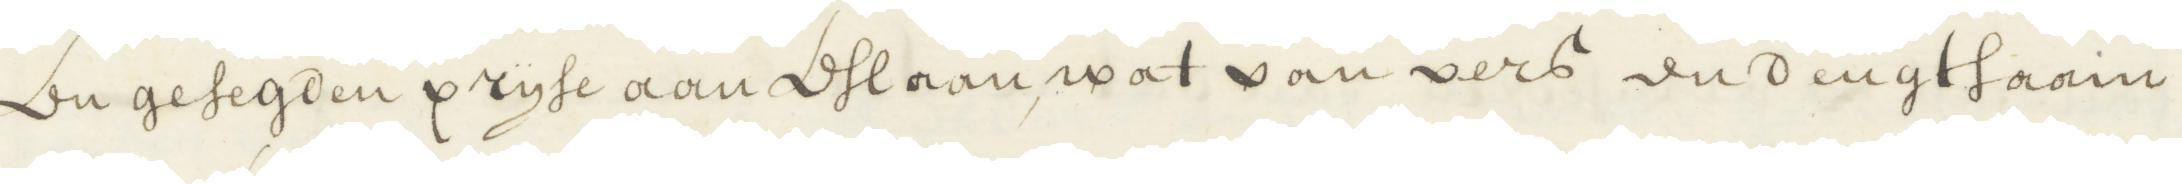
ten gesegden prijse aan teslaan, wat van vers en deugtsaam
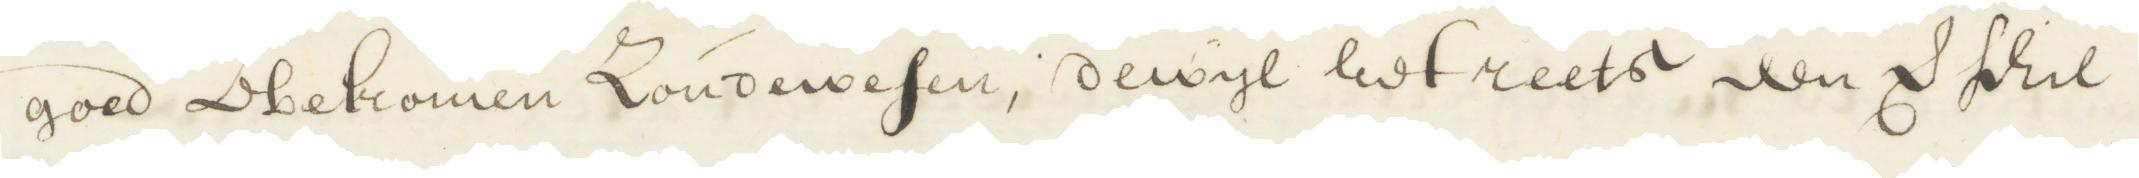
goed tebekomen zoudewesen; dewyl het reets een verschil
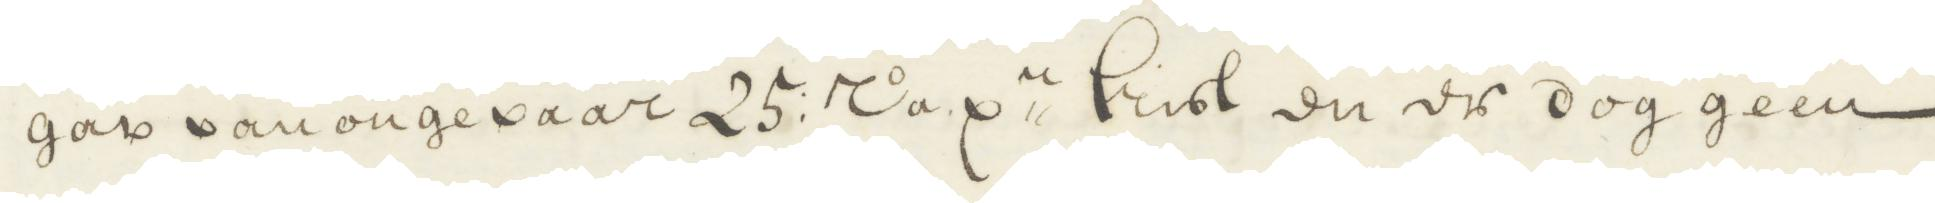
gav van ongevaar 25: roa. p„r kist en 'er dog geen
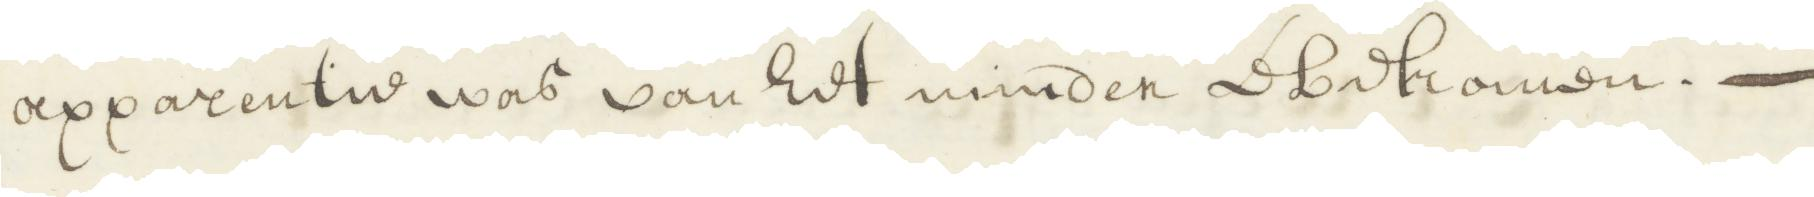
apparentie was van het minder te bekomen._
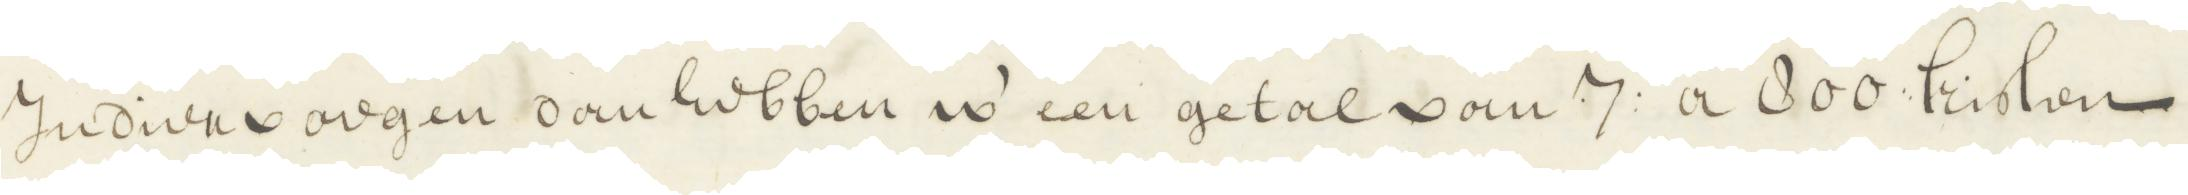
Indier voegen dan hebben w' een getal van 7: â 800: kisten
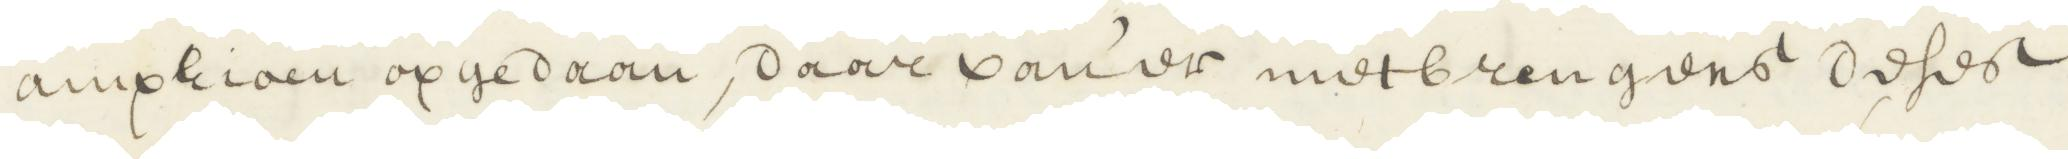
amphioen op gedaan, daar van 'er met brengers deses
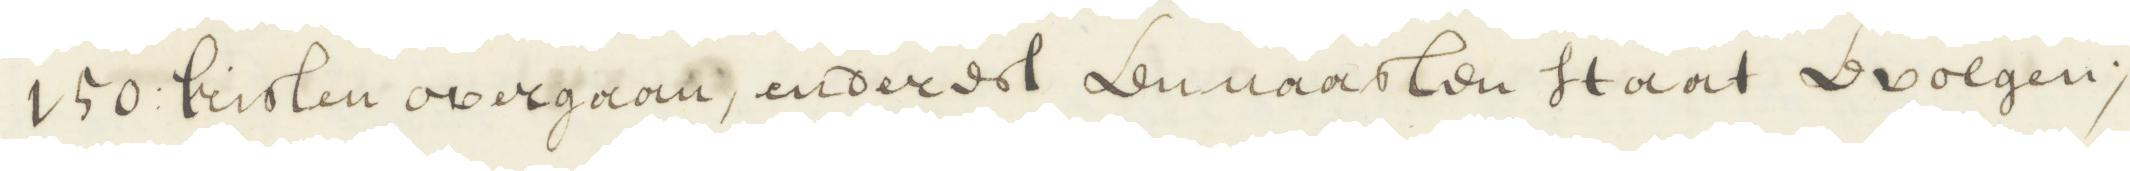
150: kisten overgaan, en de rest ten naasten staat te volgen
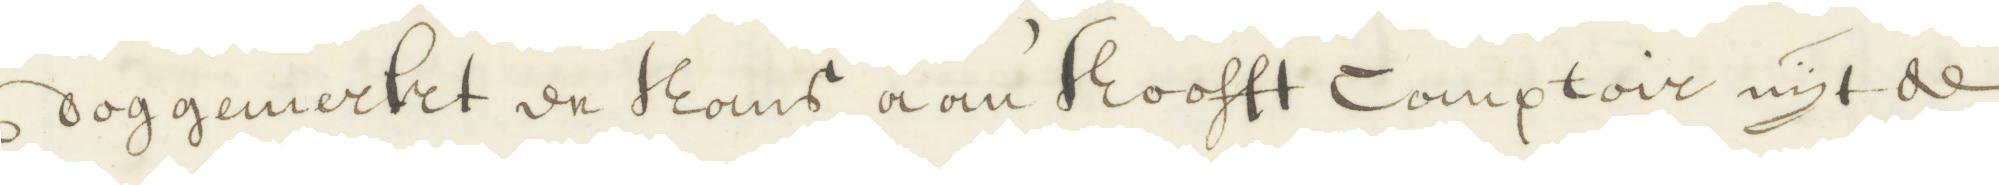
dog gemerkt en thans aan 'thoofft Comptoir uijt de
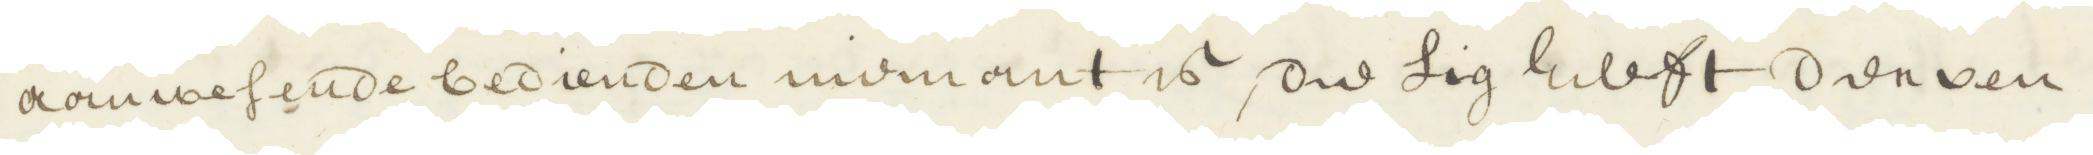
aanwesende bedienden niemant is, die sig heeft derven
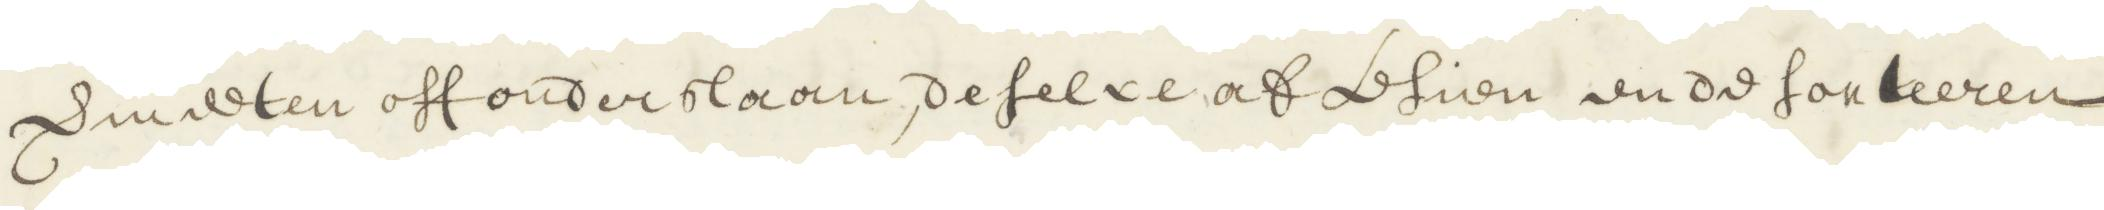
vermeeten off onder slaan, deselve af te sien en de forteeren
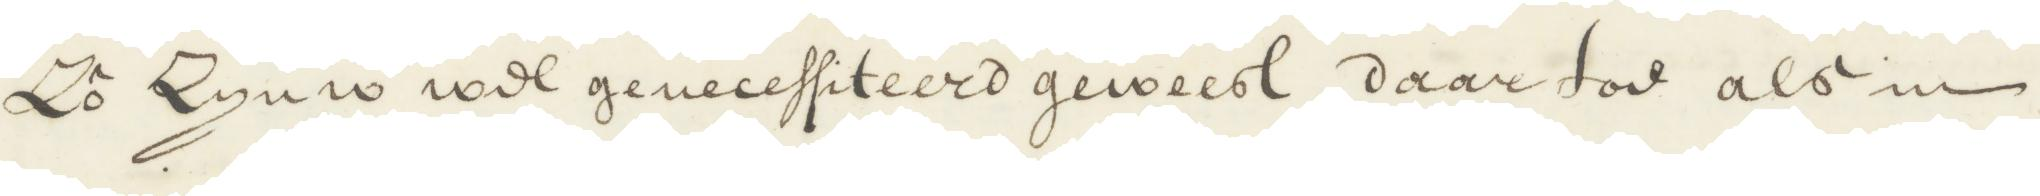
zô zyn w' wel genecessiteerd geweest, daar toe als in
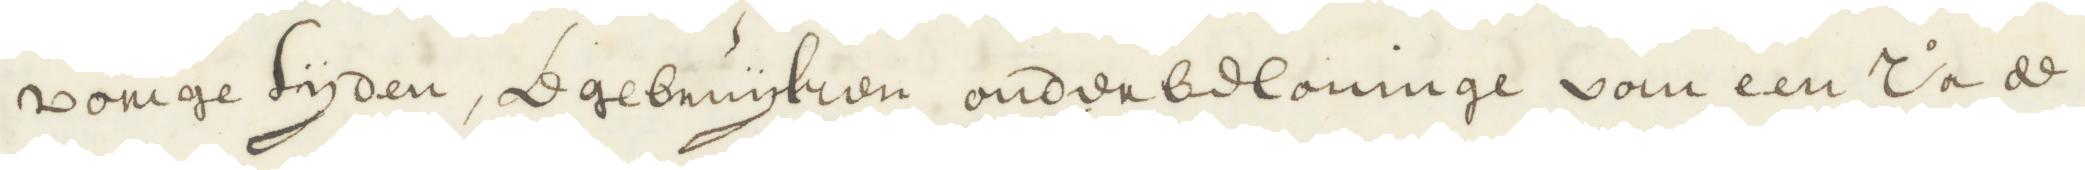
vorige tijden, te gebruijken onder beloninge van een ro/a de
